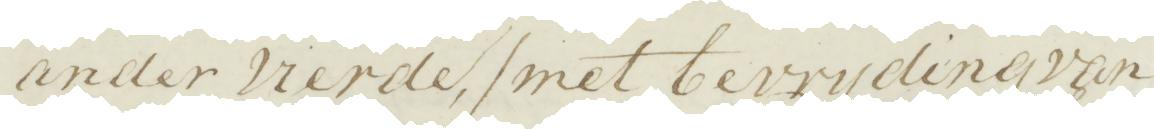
ander vierde, /met bevryding van
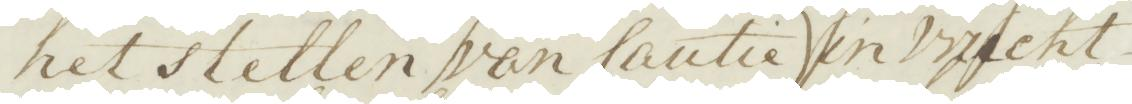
het stellen van Cautie ) in vrucht„
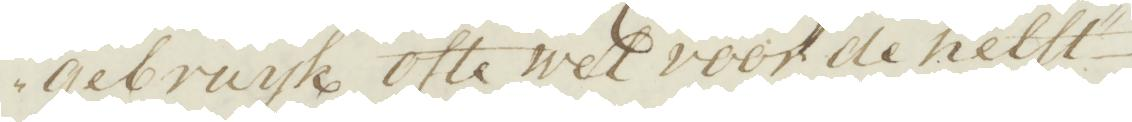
„gebruyk, ofte wel voor de helft
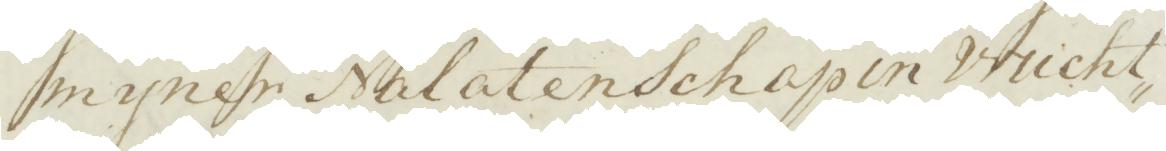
myner Nalatenschap in vrucht„
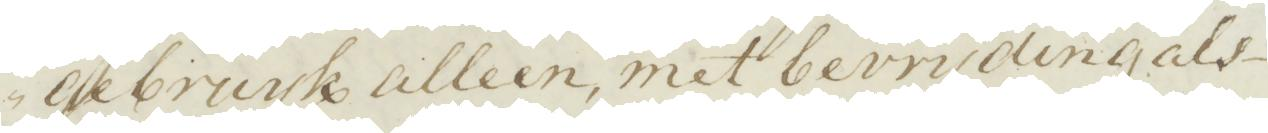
„gebruyk alleen, met bevryding als
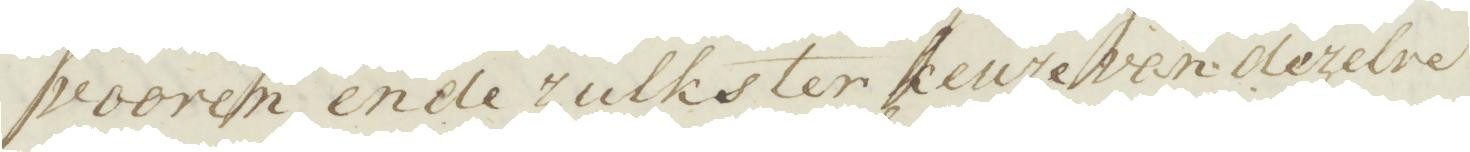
vooren, ende zulks ter keuze van dezelve
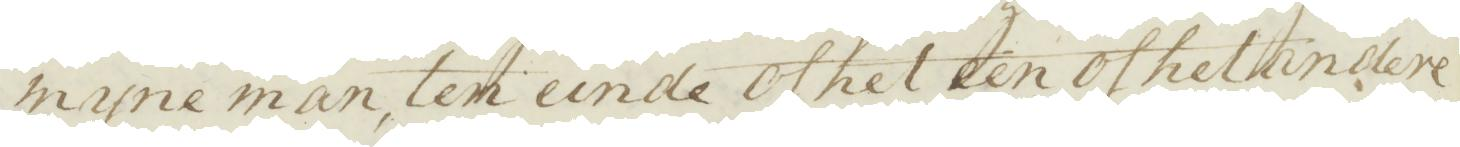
myne man, ten einde of het een of het andere
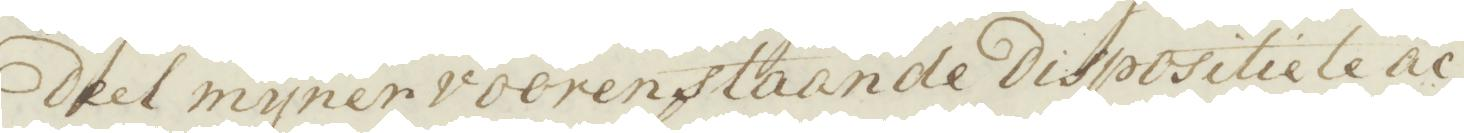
deel myner voorenstaande dispositie te ac
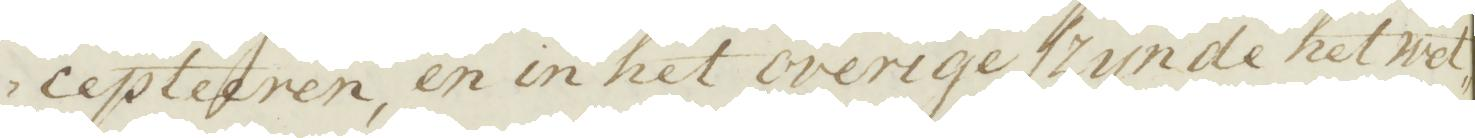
„cepteeren, en in het overige, /zynde het wet„
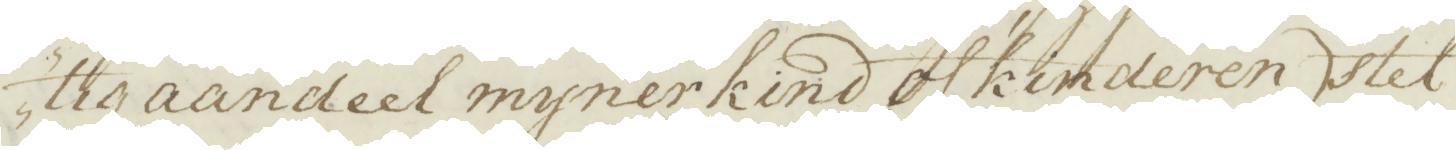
„tig aandeel myner kind of kinderen, ) stel
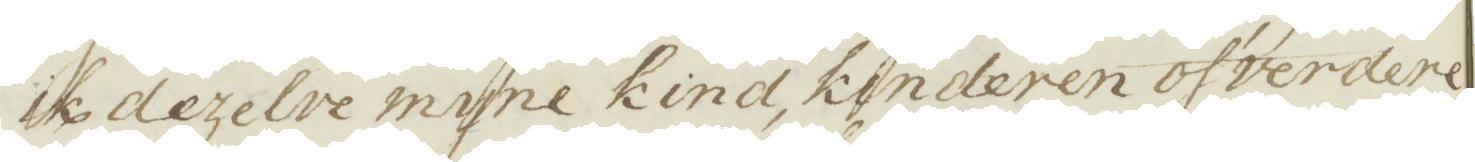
ik dezelve myne kind, kinderen of verdere
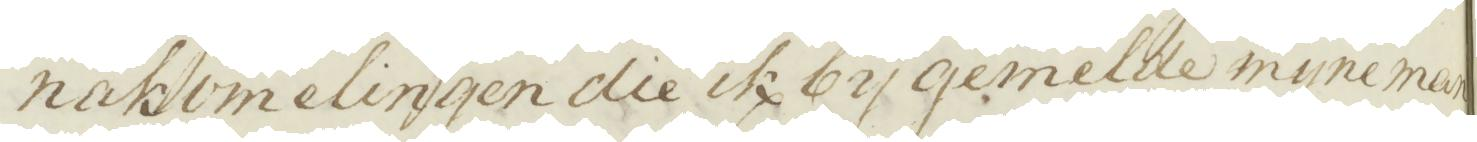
nakomelingen die ik by gemelde myne man
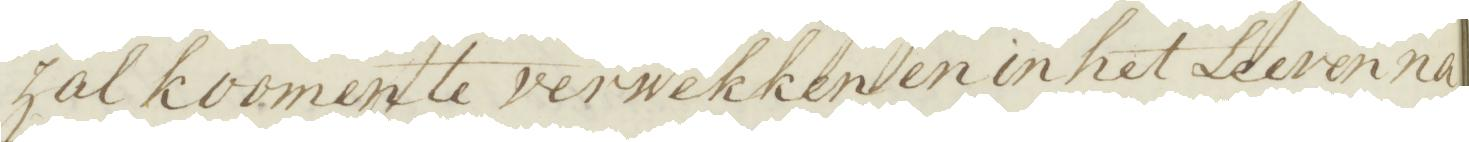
zal koomen te verwekken en in het Leeven na
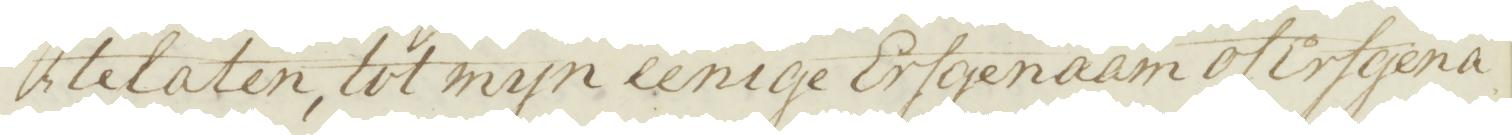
„telaten, tot myn eenige Erfgenaam of Erfgena
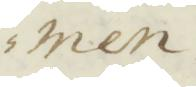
„men
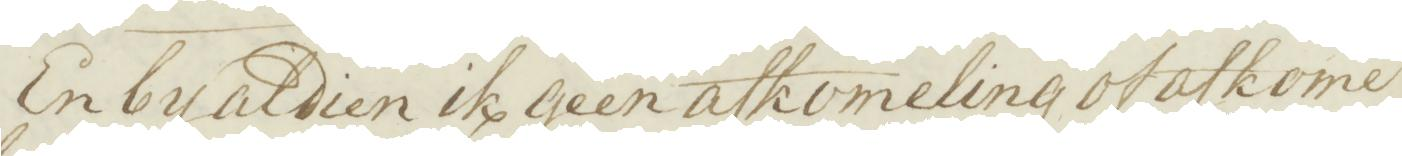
En by aldien ik geen afkomeling of afkome
